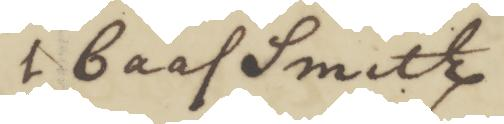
1 baas smith
